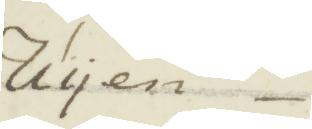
uijen -
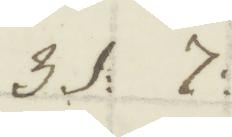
31: 7:
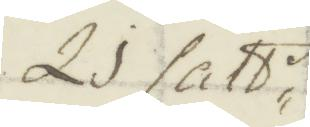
21 Catts
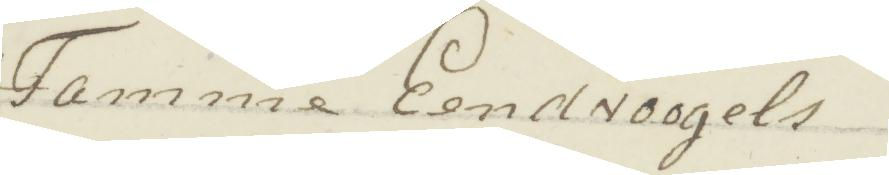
Tamme Eendvoogels
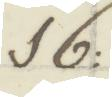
16:
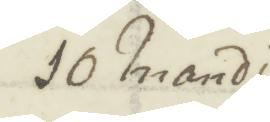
10 mandj
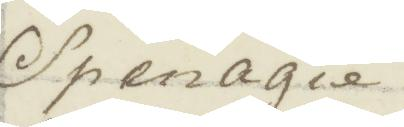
Spenagie
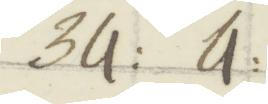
34: 4:
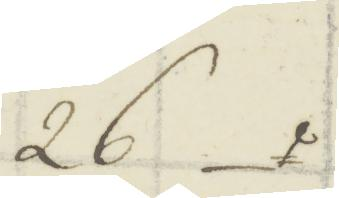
26 _o
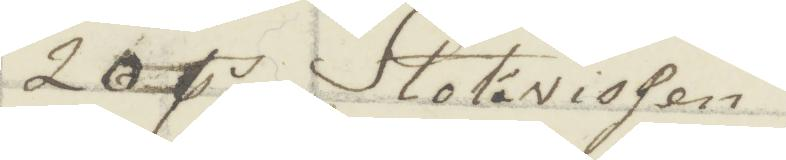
20 ps Stokvissen
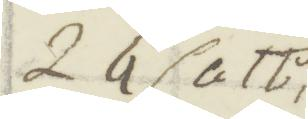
24 Catt,s
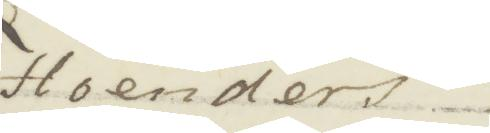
Hoenders -
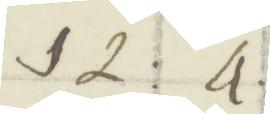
12: 4:
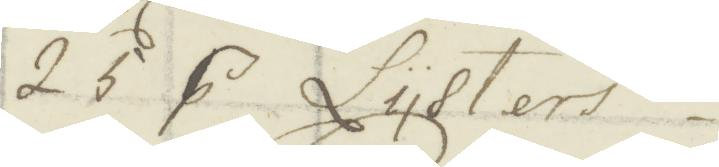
25 ps Lijsters
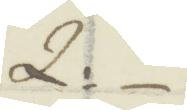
2: -
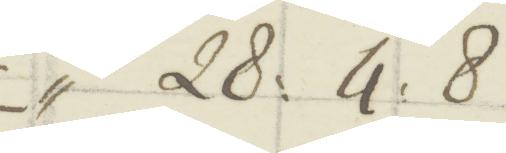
„ 28: 4: 8
